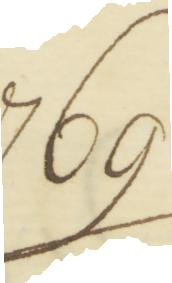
769
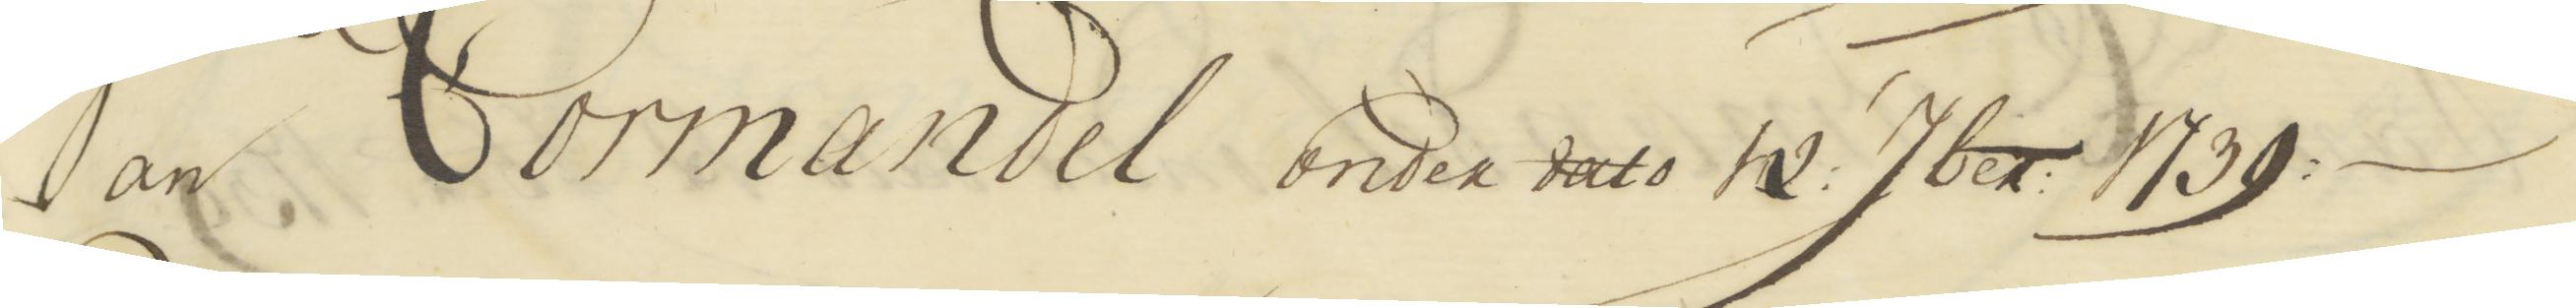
Van Cormandel onder dato 12:' 7ber: 1739: —
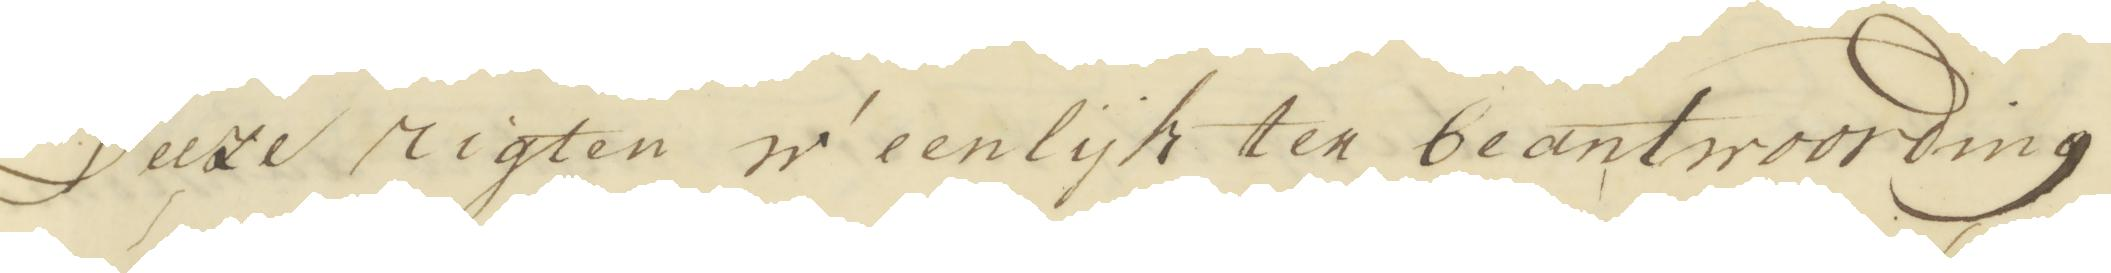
Deeze rigten w' eenlijk ter beantwoording
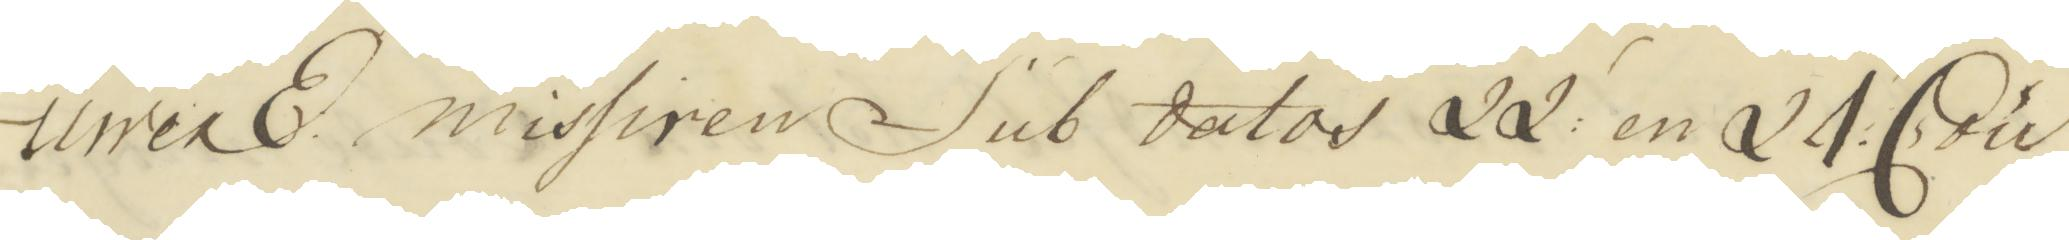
uwer E: missiven Sub datos 22:' en 24:' Cou
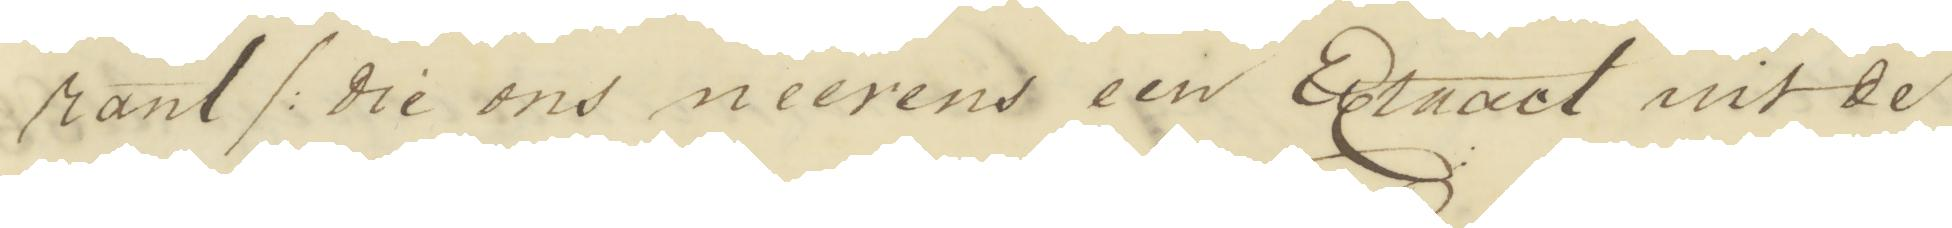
rant /: die ons neevens een Extract uit de
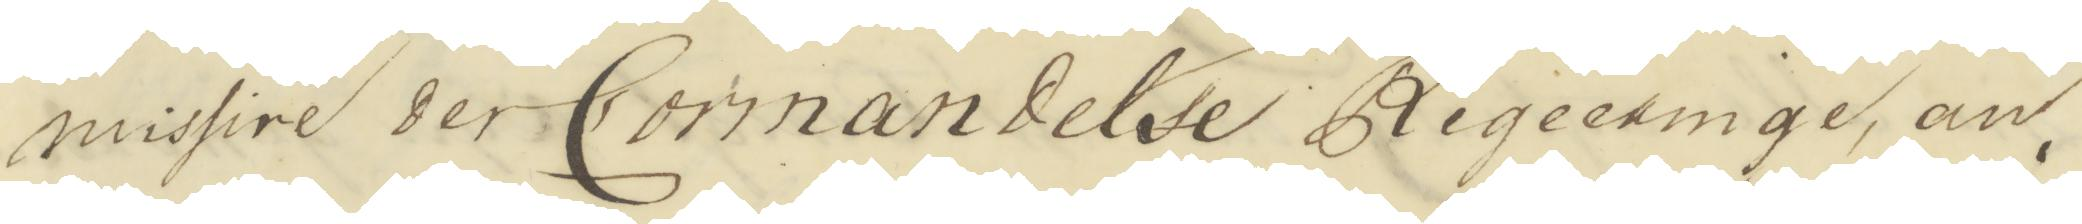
missive der Cormandelse Regeeringe, an„
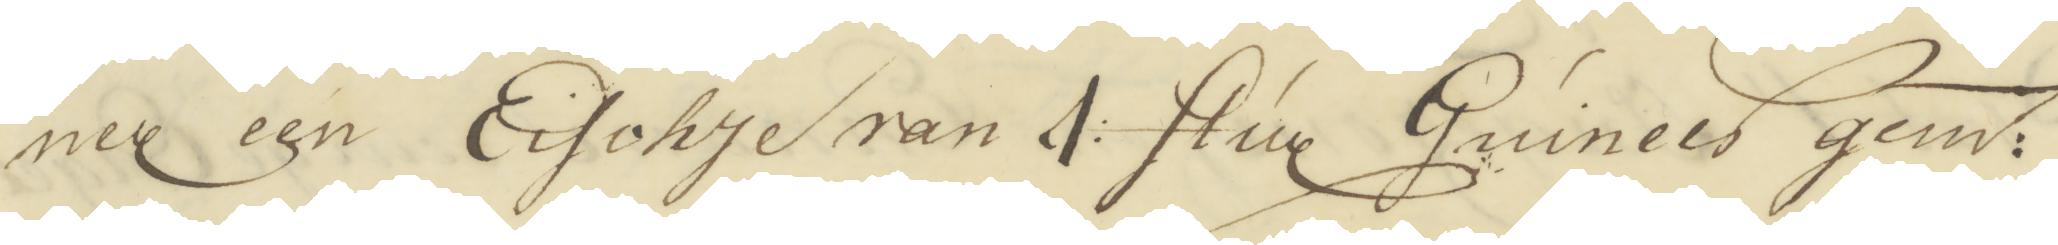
nex een Eischse van 4: Stux Guinees gem:
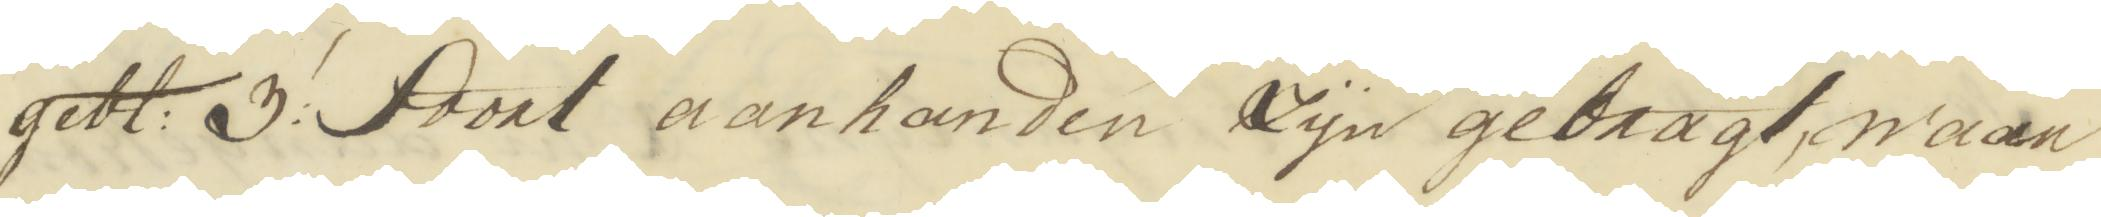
gebl: 3:' Soort aan handen zijn gebragt, waar
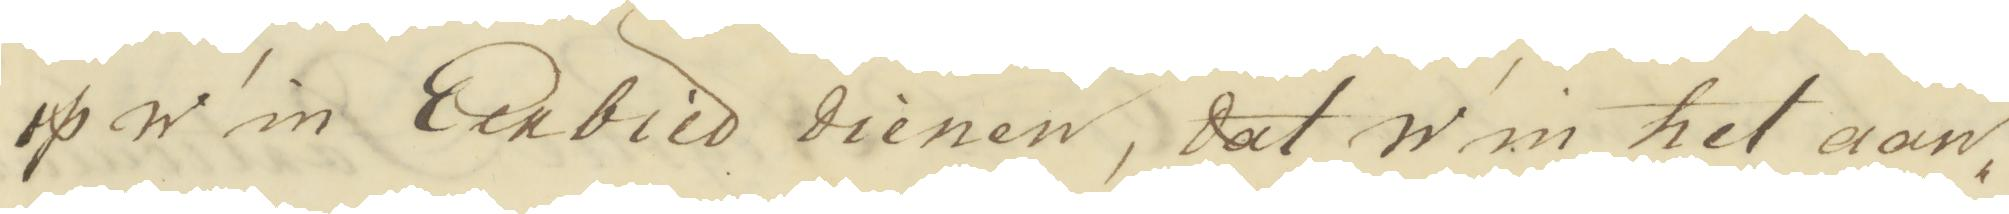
op w' in Eerbied dienen, dat w' in het aan„
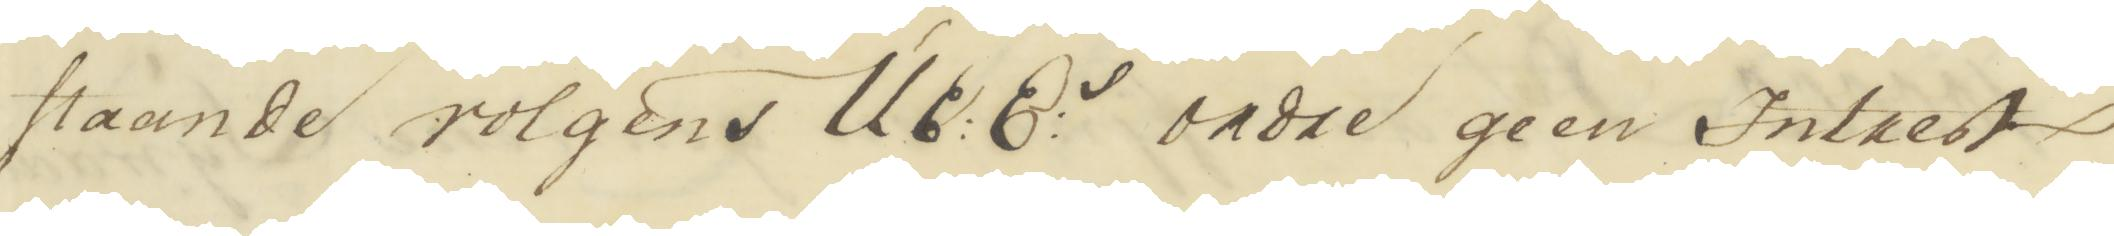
staande volgens U E:E:s ordre geen Intrest
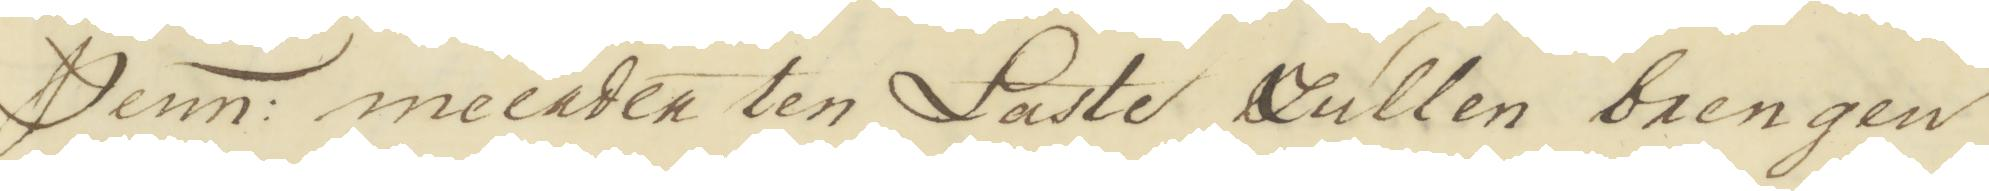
Penn: meerder ten Laste zullen brengen
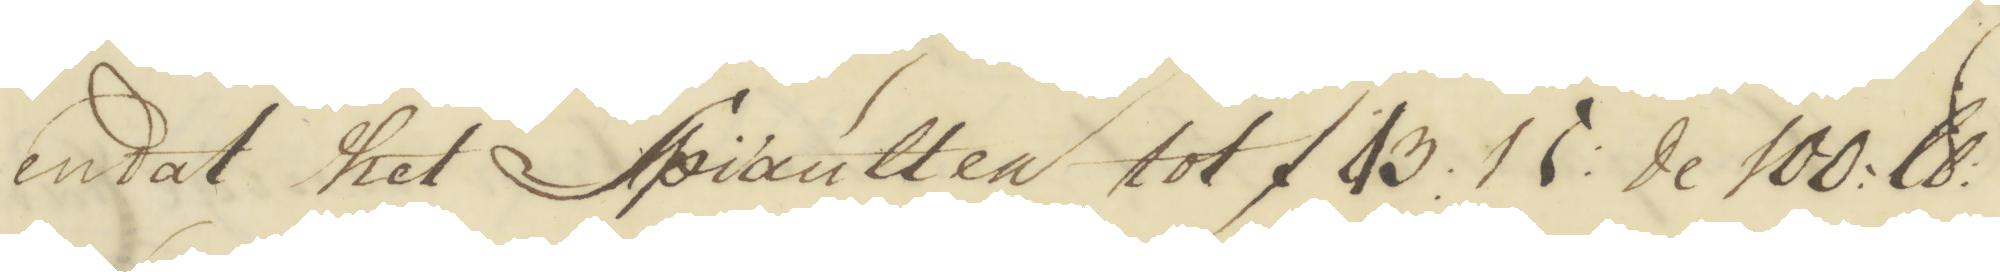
en dat het Spiaulter tot ƒ 43: 15: de 100: lb:
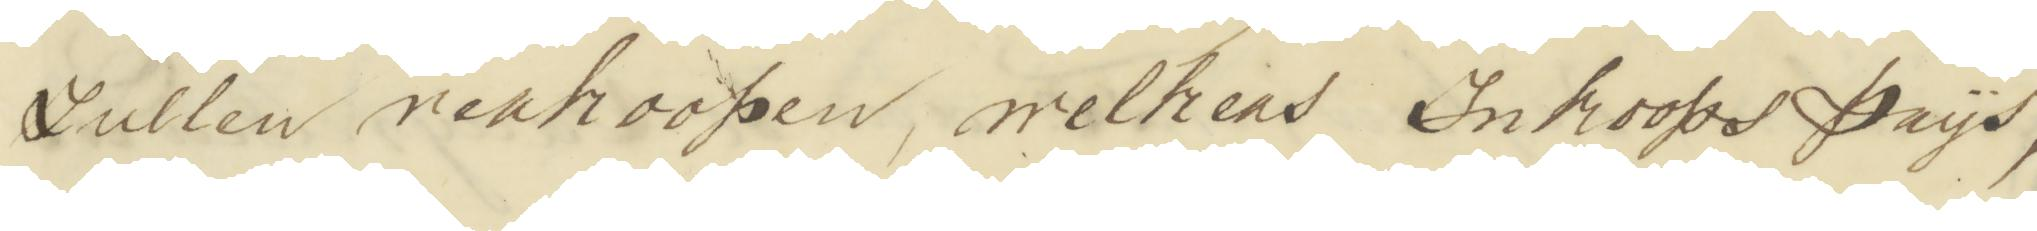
zullen verkoopen, welkers Inkoops prijs,
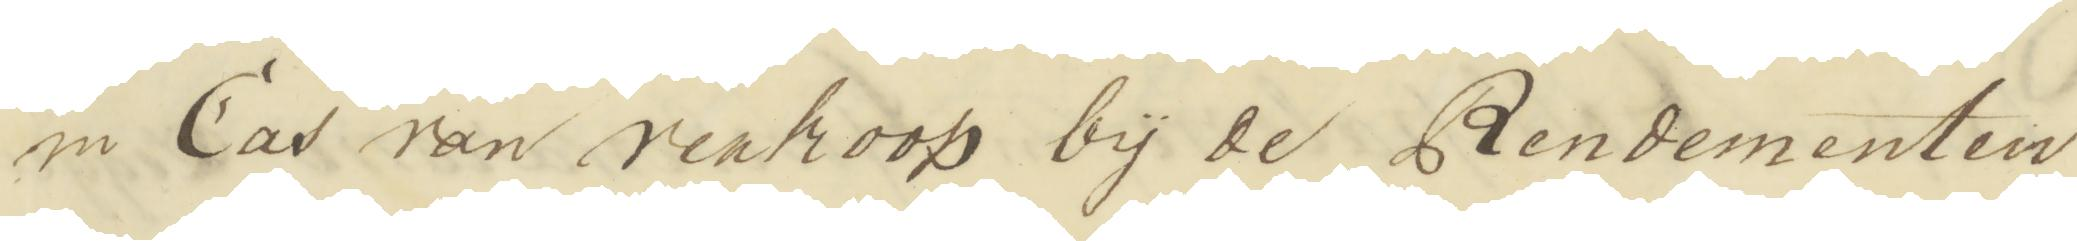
in Cas van verkoop bij de Rendementen
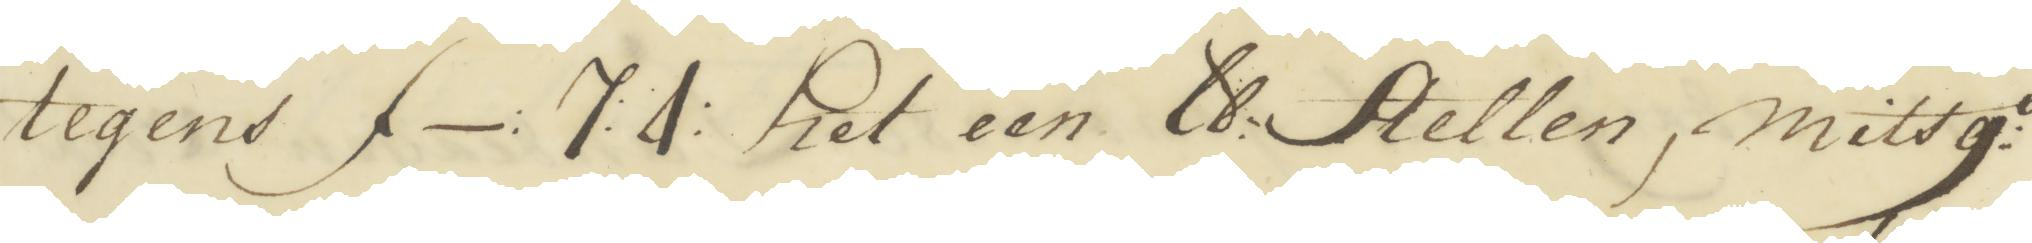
tegens ƒ —: 7: 4: het een lb: Stellen, mitsg:s
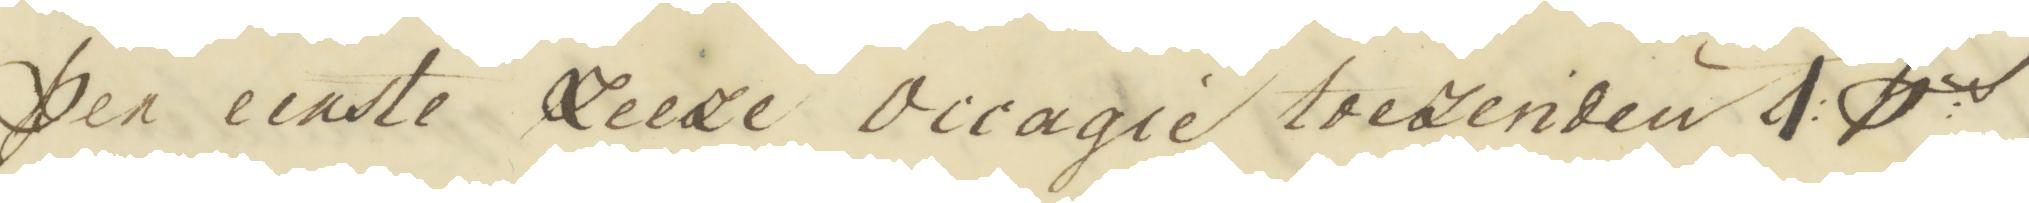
per eerste Zeeze occagie toezenden 4: p:s
